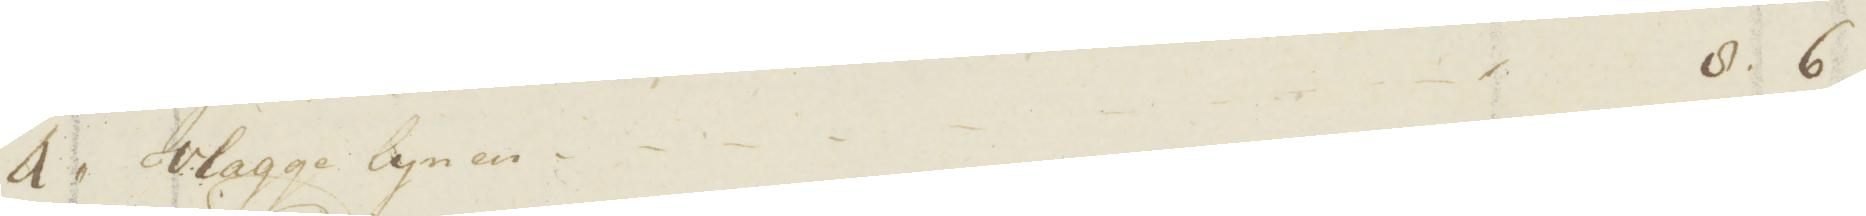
4 „ vlagge lijnen - - - - - - - - - „ 8. 6
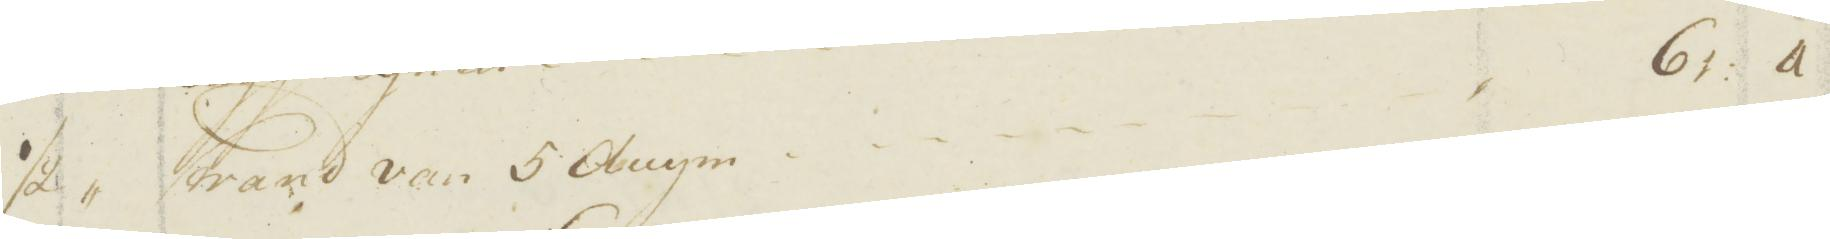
½ „ wand van 5 duym - - - - - - - - - „ 61: 4
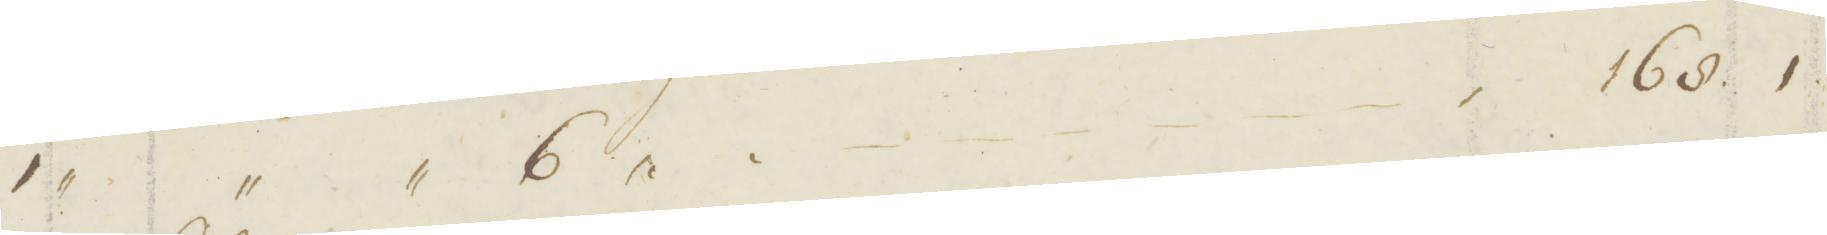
1 „ „ „ 6 „ - - - - - - - „ 168. 1.
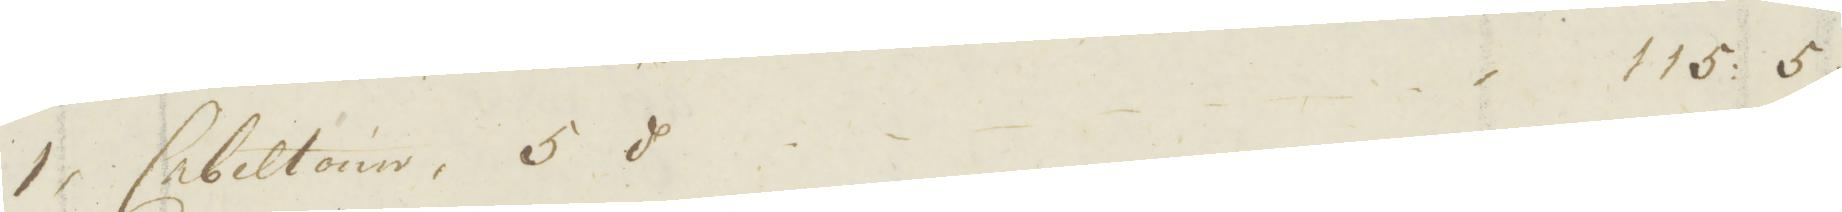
1 „ Cabeltouw „ 5 do - - - - - - - „ 115: 5
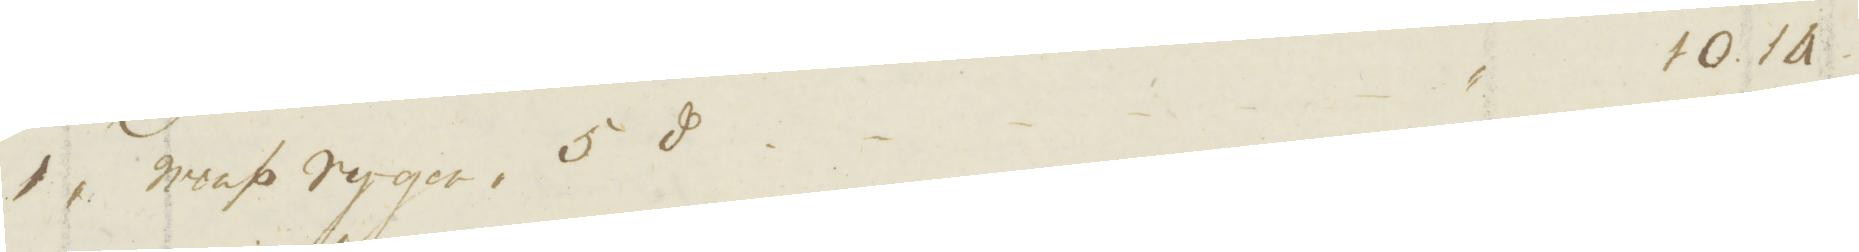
1 „ worp vyger „ 5 do - - - - - - „ 10. 14
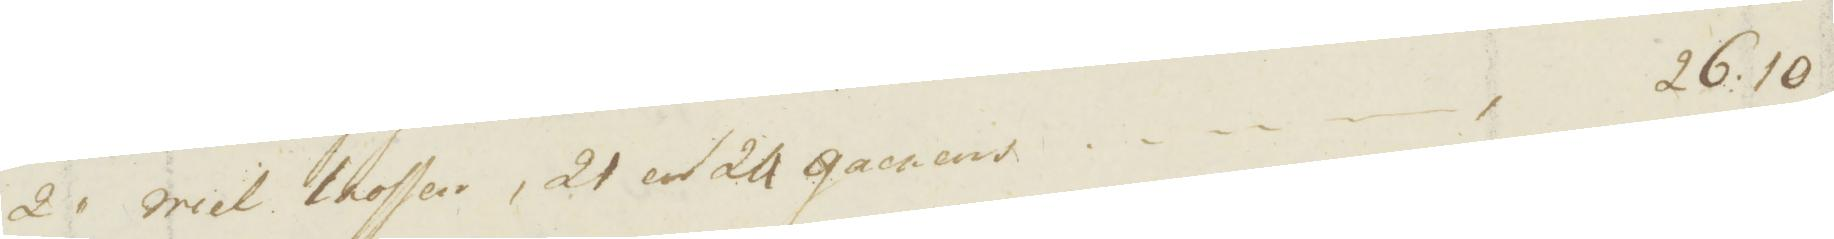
2 „ wiel trossen „ 21 en 24 gaerens- - - - - - „ 26: 10
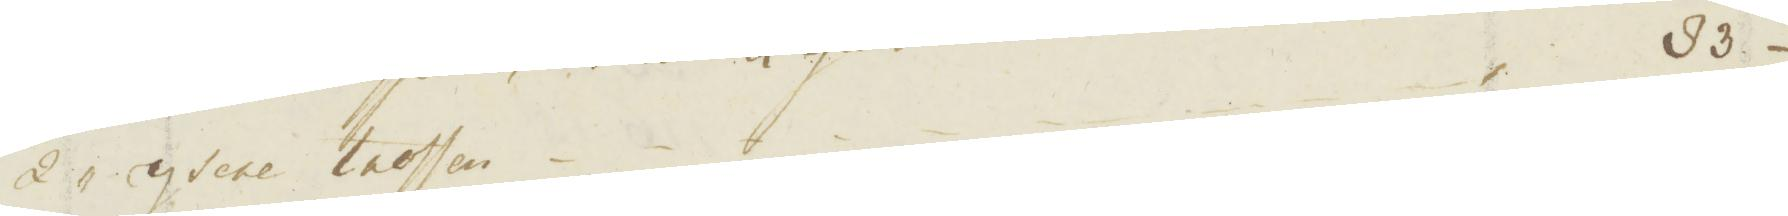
2 „ ijsere trossen - - - - - - - - - - „ 93. —
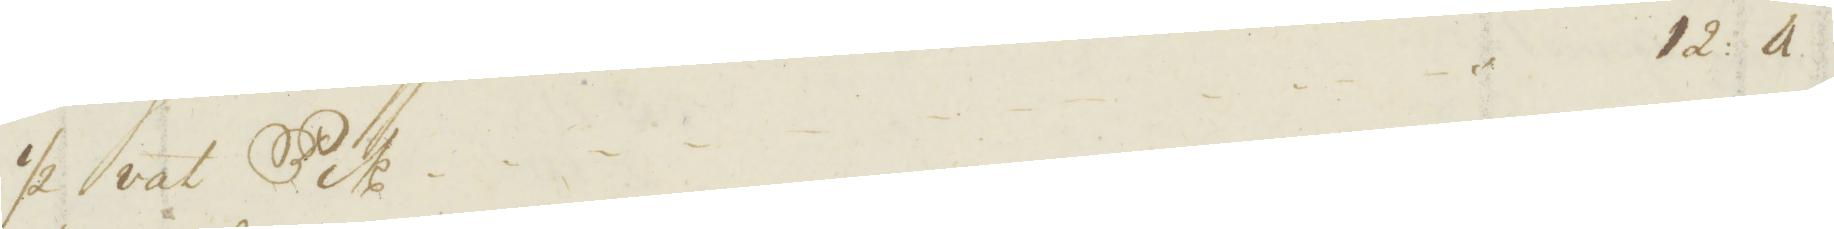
½ vat Pik - - - - - - - - - - - - „ 12: 4
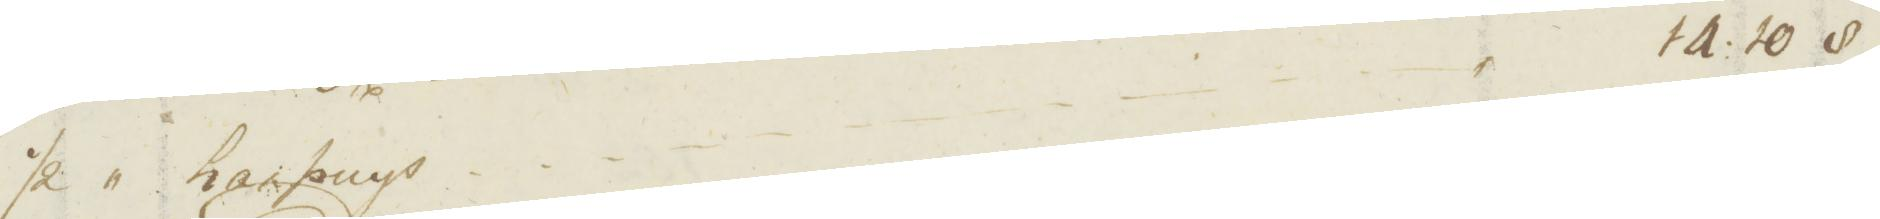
½ „ harpuys - - - - - - - - - - - - - „ 14: 10 8
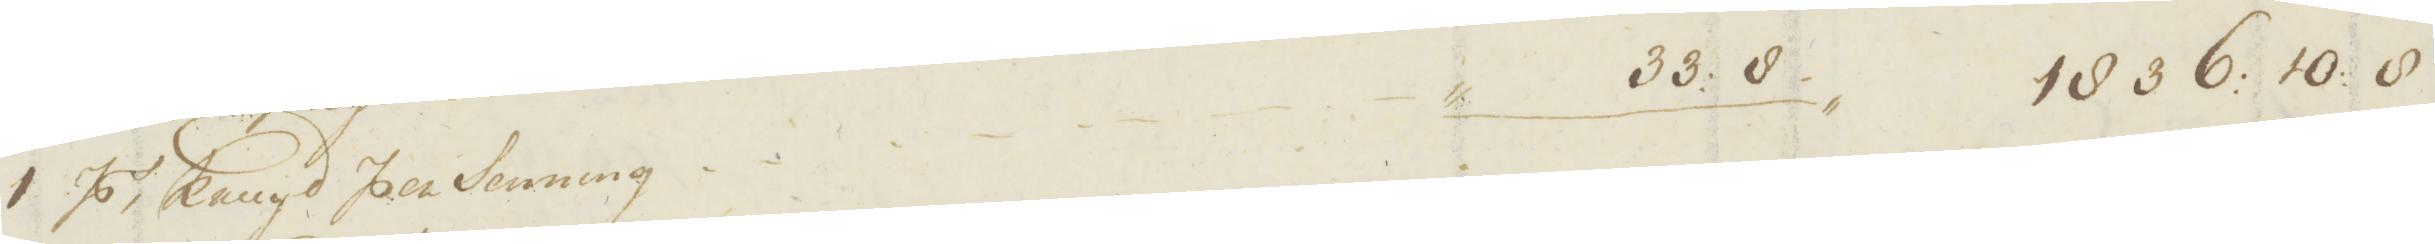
1 p„s kruyd per senning - - - - - - - - „ 33: 8 „ 1836: 10: 8
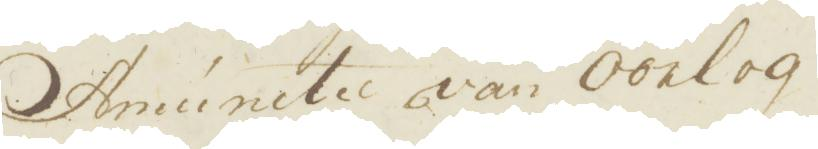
Amunitie van Oorlog
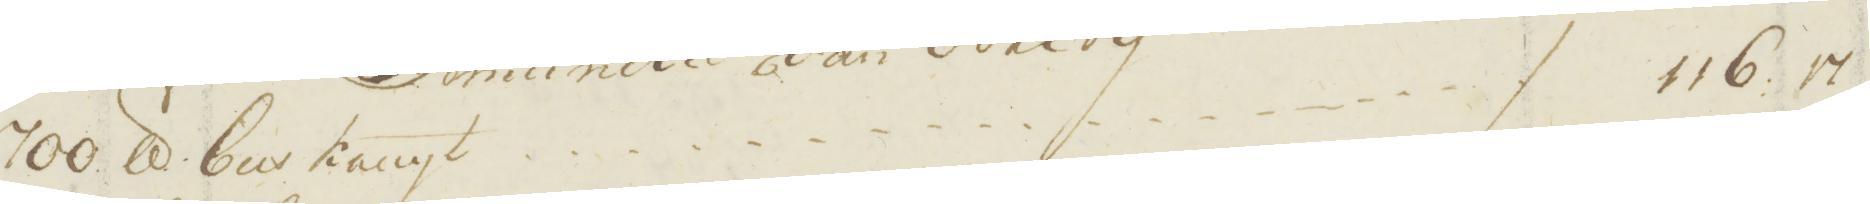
700 lb: bus kruyt - - - - - - - - - - - - - - - - - - - ƒ 116: 17
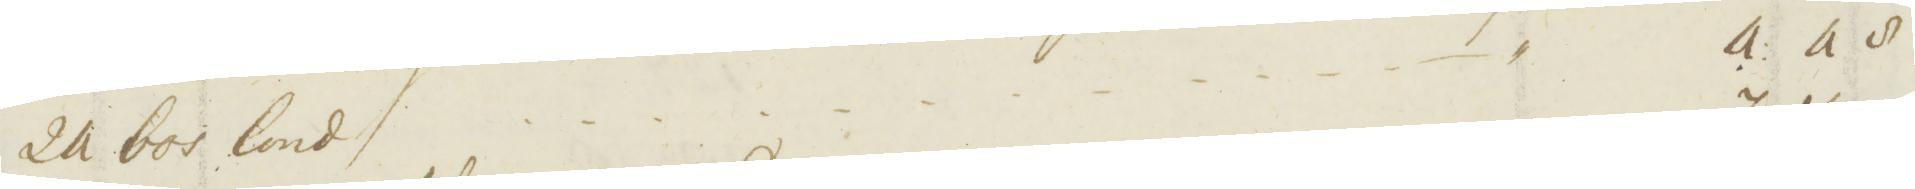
24 bos lond - - - - - - - - - - - - - „ 4: 4 8
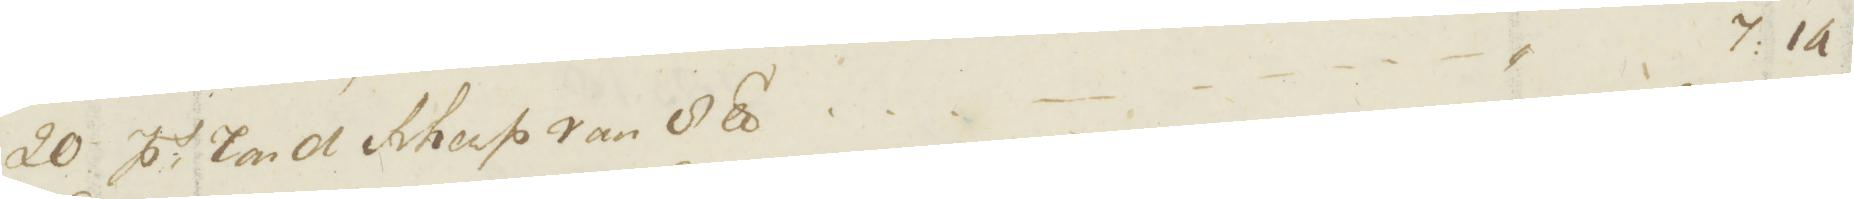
20 p„s rond scherp van 8 lb - - - - - - - - - - - „ 7: 14
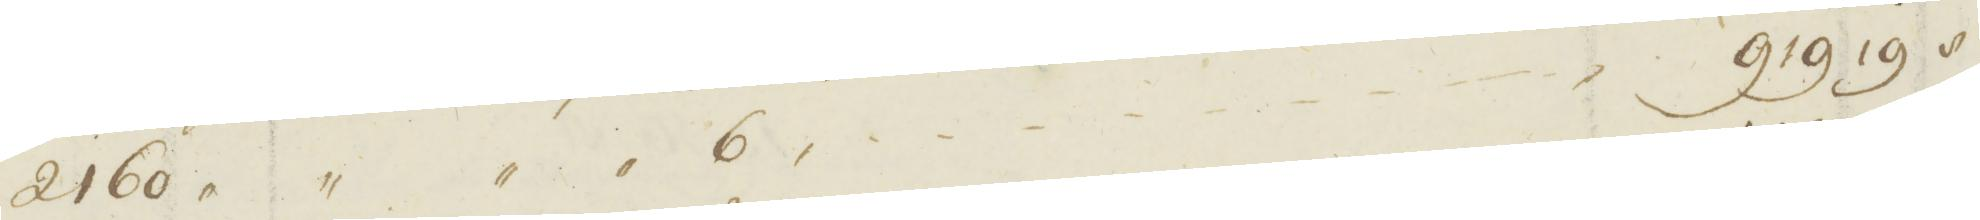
2160 „ „ „ „ 6 „ - - - - - - - - - „ 919 19 8
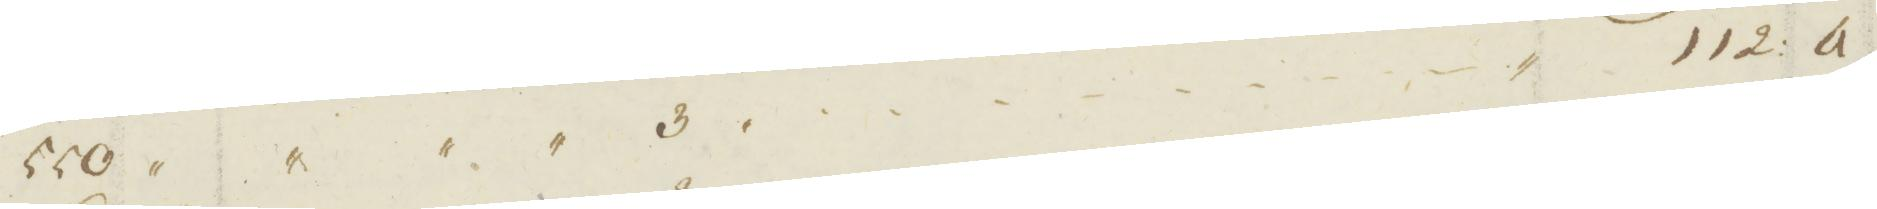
550 „ „ „ „ 3 „ - - - - - - - - „ 112: 4
